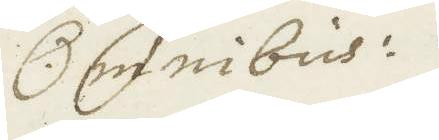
Omnibus:
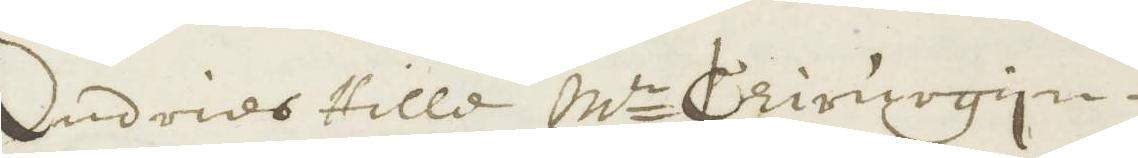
Andries Hille m=r Chirurgijn
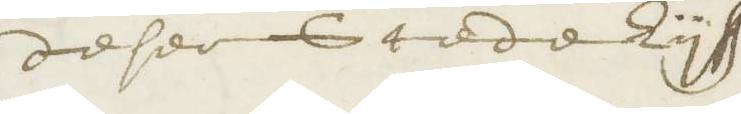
deser stede Eijss=r
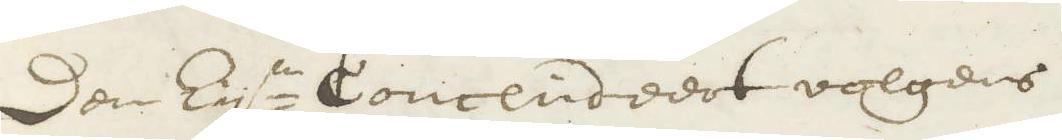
Den Eij=r Concludeert volgens
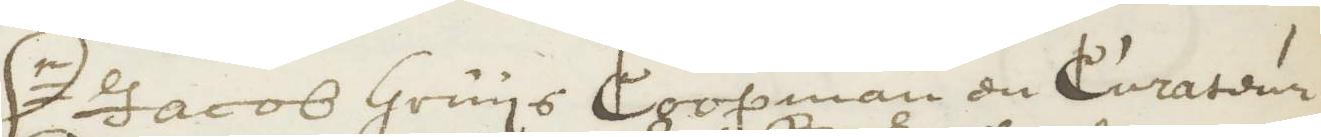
S=r Jacob Gruijs Coopman en Curateur
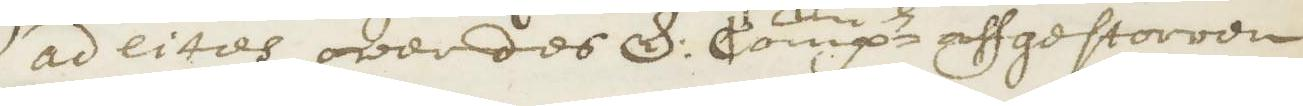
ad lites over des E: Comp=s affgestorven
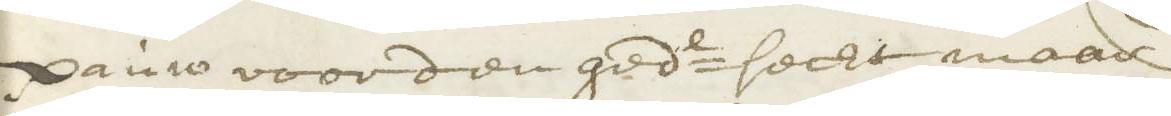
pauw voor den ged=e secht maar
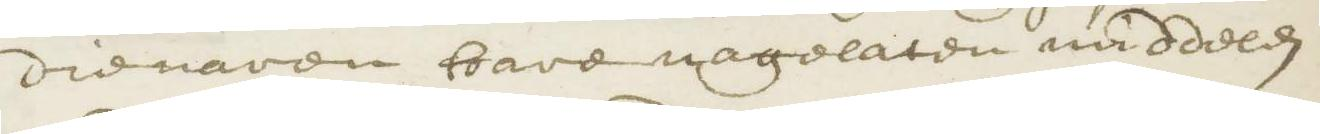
dienaren hare nagelaten middelen
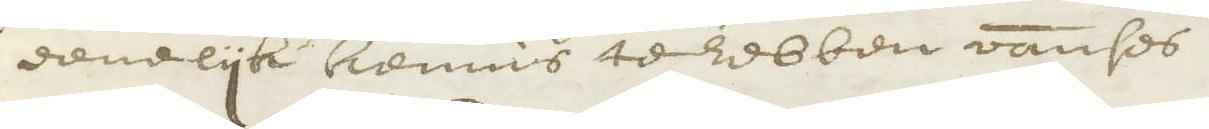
eenelijk kennis te hebben vanses
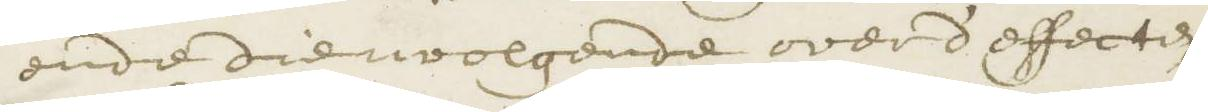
ende dienvolgende over d’effecten
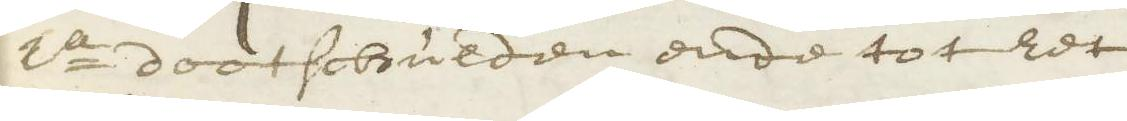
r=a dootschulden ende tot het
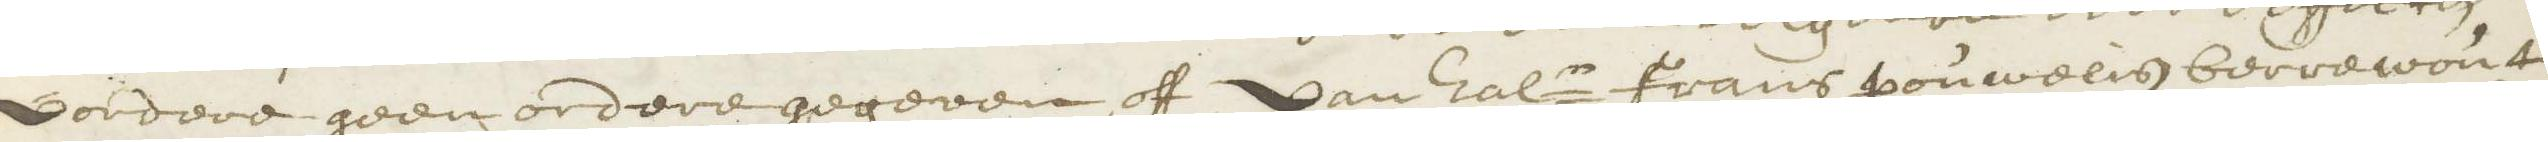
vordere geen ordere gegeven of van zal=n Frans pouwelisz berrewout
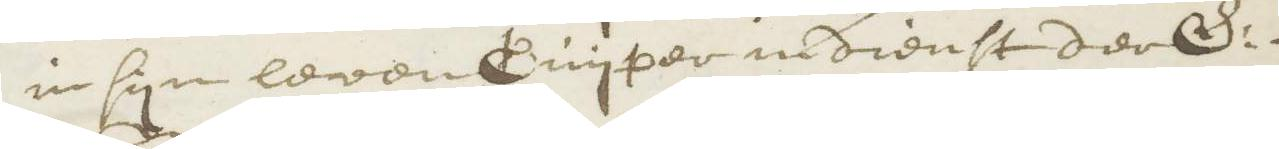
in sijn leven Cuijper in dienst der E:
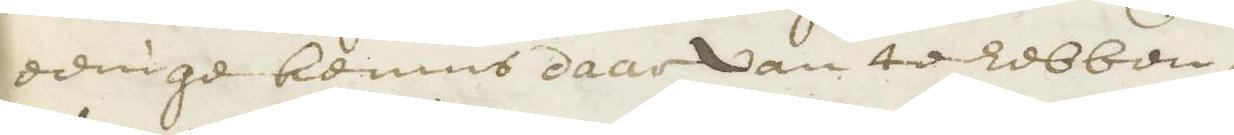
eenige kennis daarvan te hebben
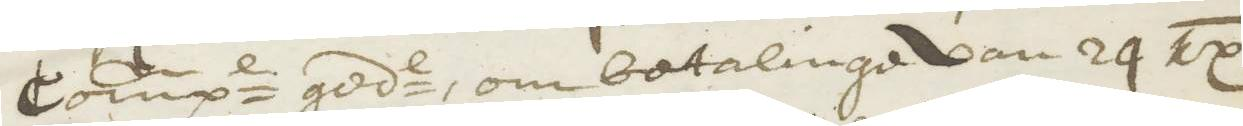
Comp=e ged=e, om betalinge van 24 rx
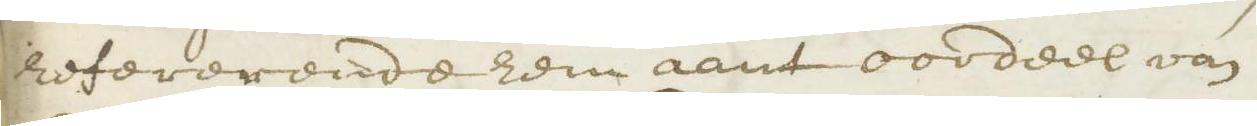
refererende hem aant oordeel van
